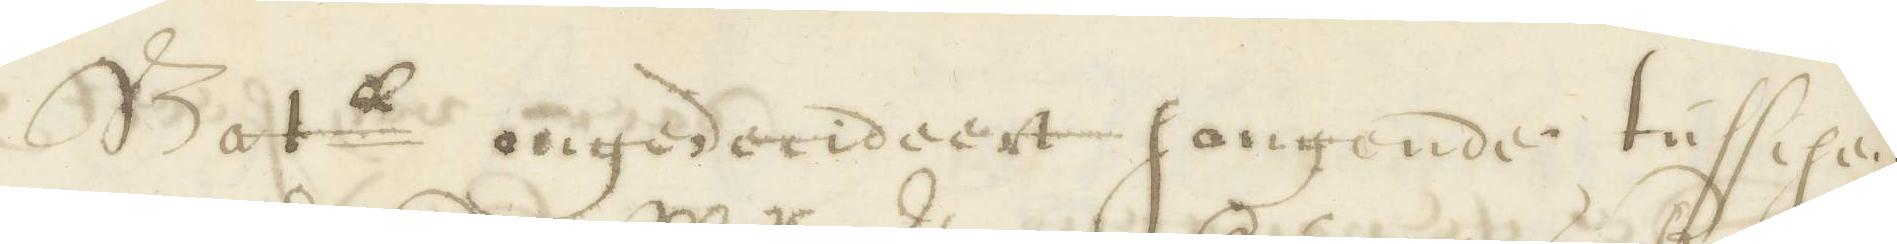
Bat=el ongedecideert hangende tusschen
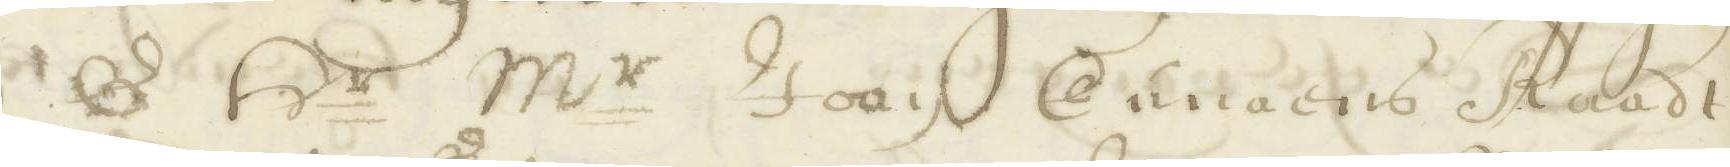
d' E H=r M=r Ioan Cunaens Raadt
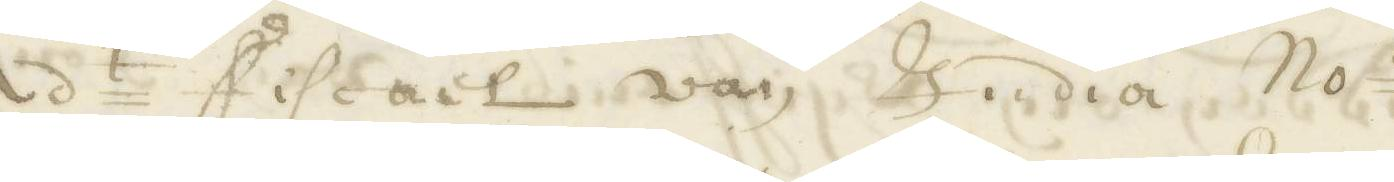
en Ad=t fiscael van India No
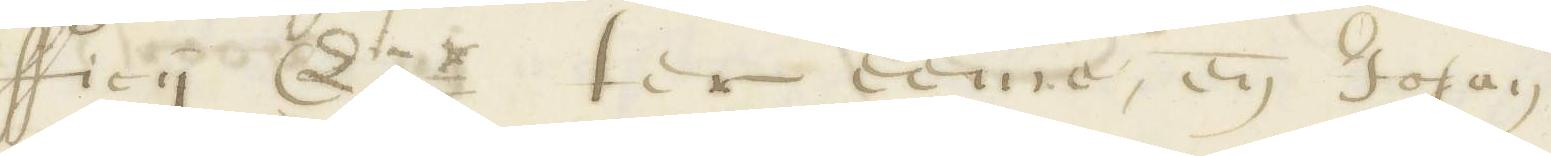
Officq Eij=r ter eenre, en Iohan
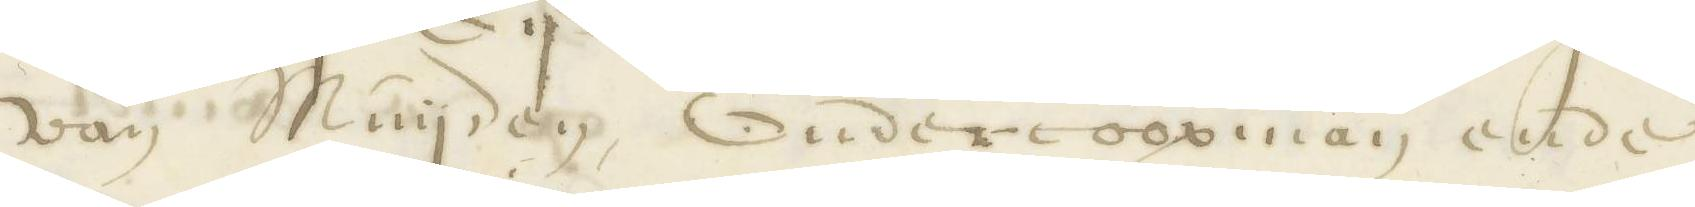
van Muijden, Ondercoopman ende
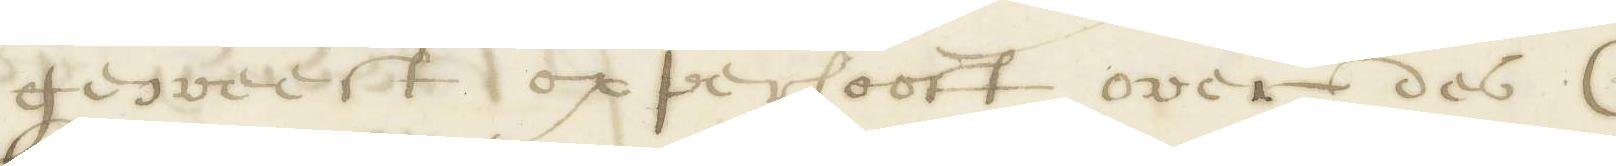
geweest op paspoort over des E
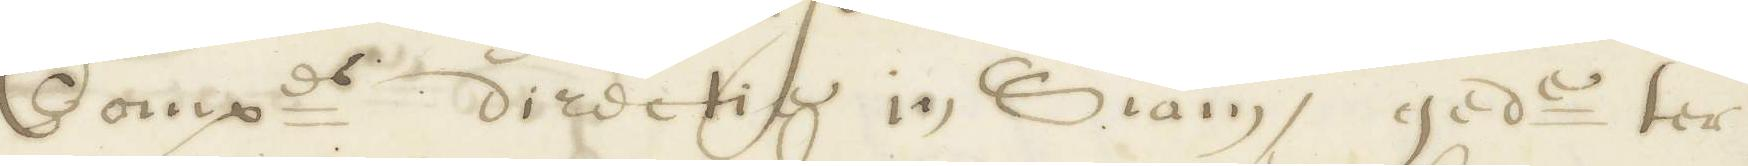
Comp=es directie in Siam, ged=e ter
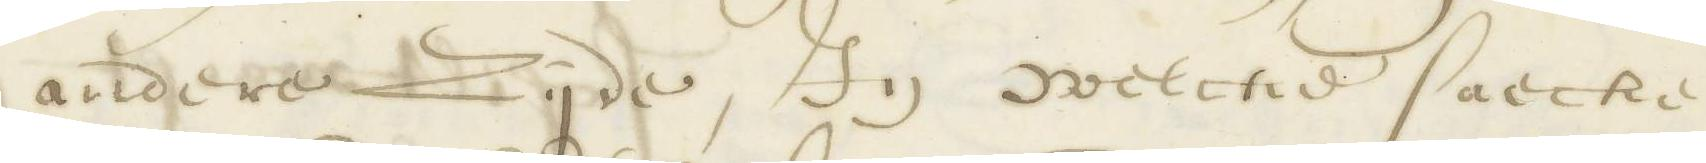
andere zijde, In welcke saecke
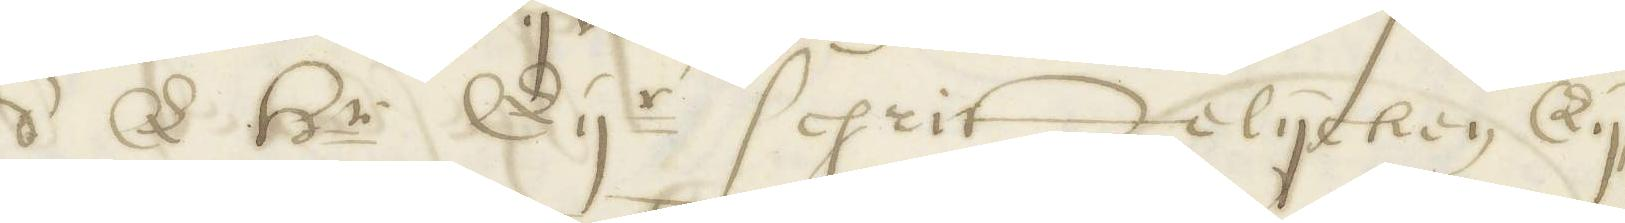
d’ E h=r Eij=r schriftelijcken Eijsch
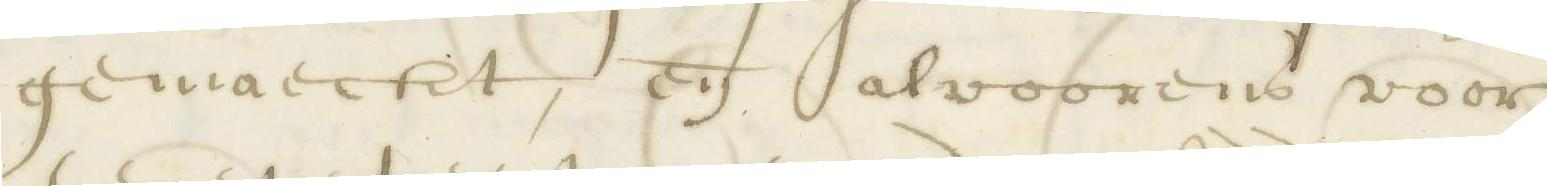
gemaeckt, alvoorens voor
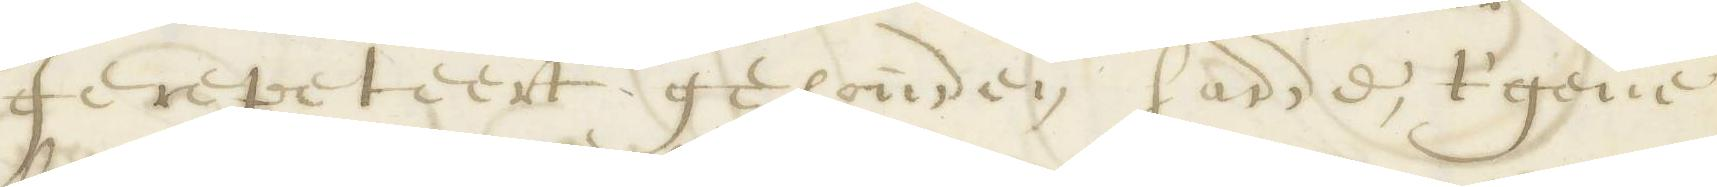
gerepeteert gehouden hadde, t'gene
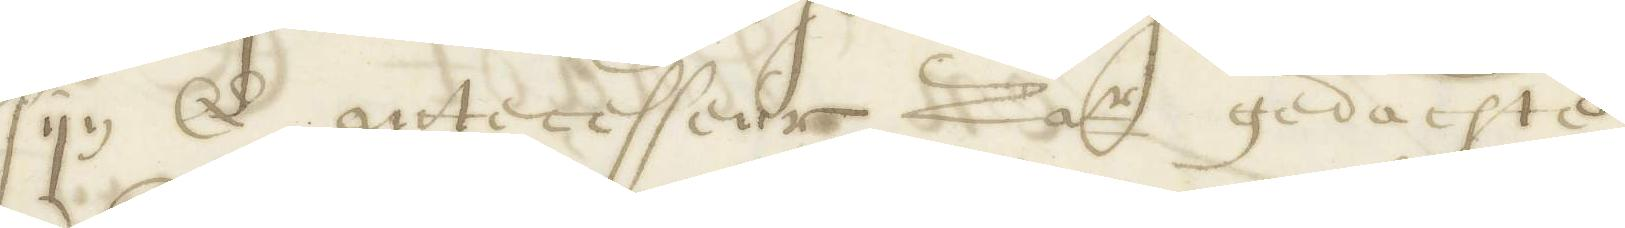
sijn E antecesseur za=r gedachte
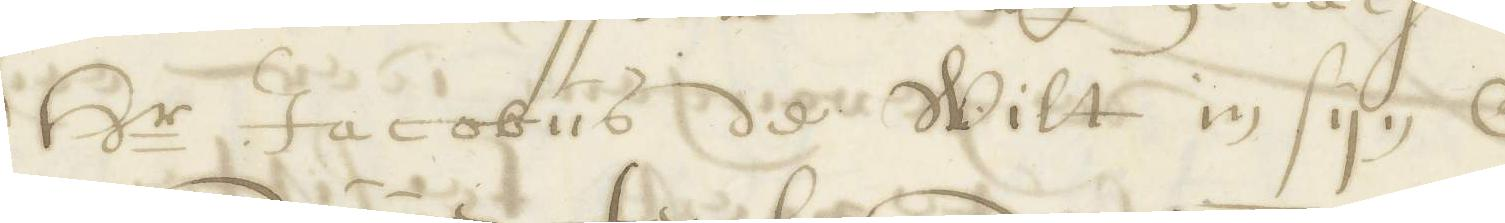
d' H=r Jacobus de Wilt in sijn
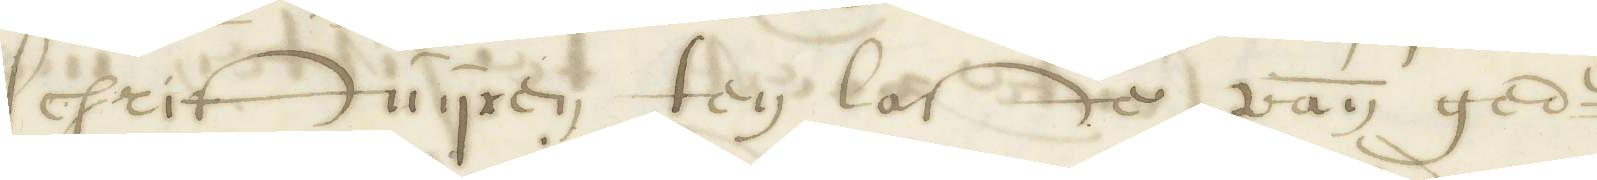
schriftuijren ten laste van ged
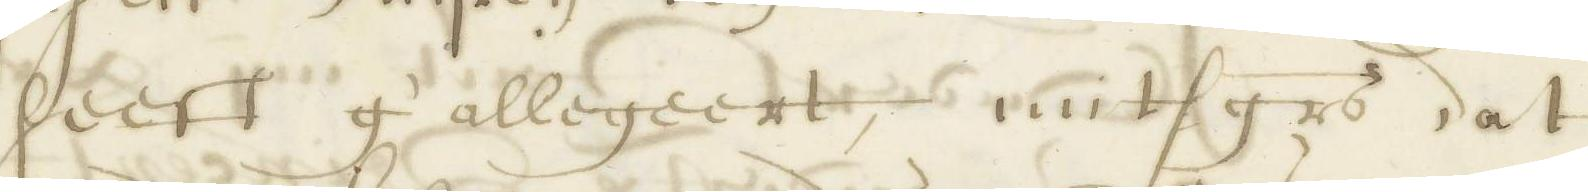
heeft g’allegeeert, mitsgrs dat
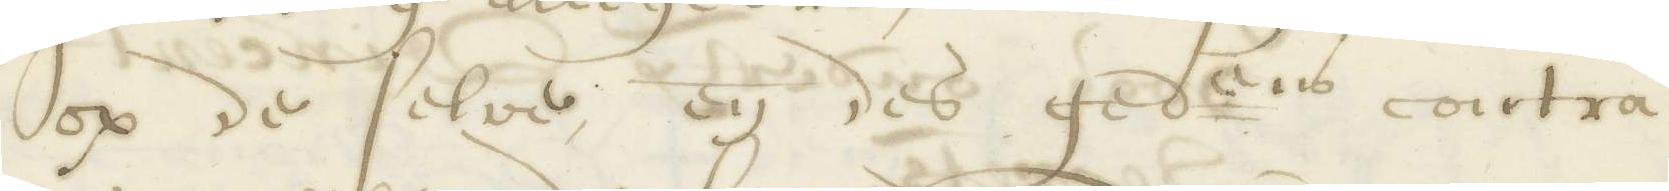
op de selve en des ged=ens contra
